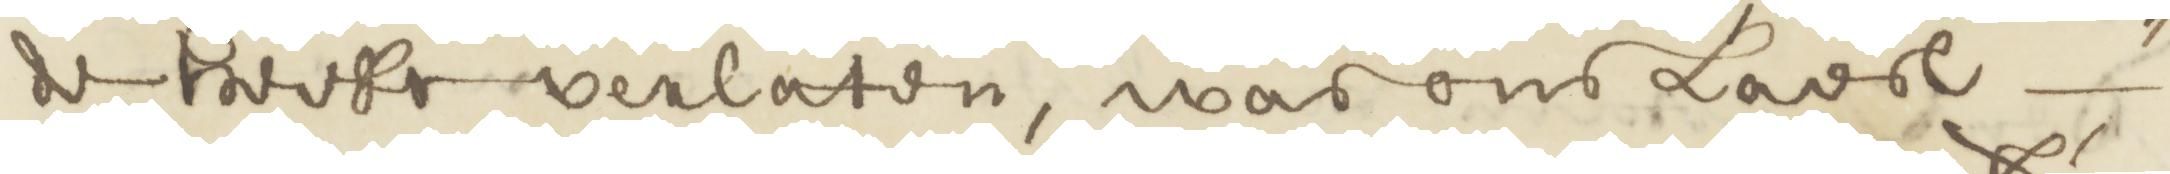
de heeft verlaten, was ons laest —
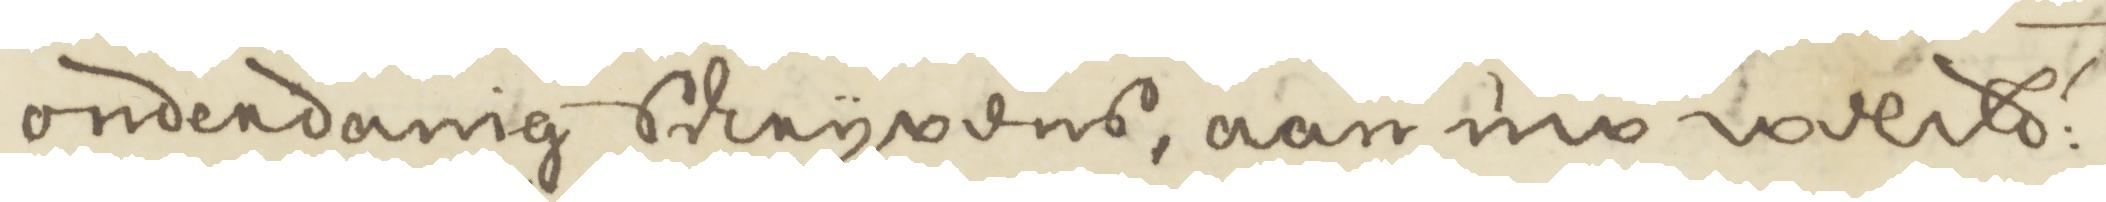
onderdanig schrijvens, aan uw wel Ed:'
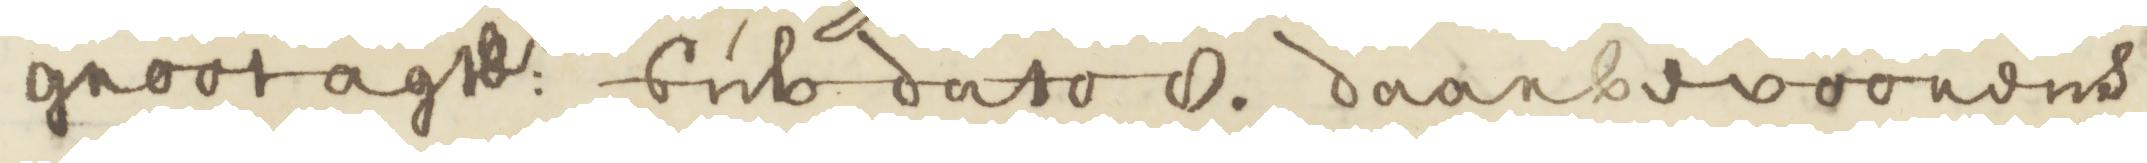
groot agtb: sub dato 8. daar bevoorens
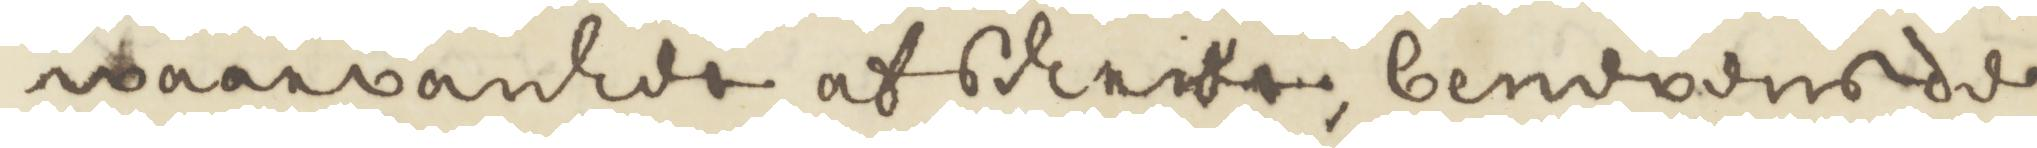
waarvan het afschrift, benevens de
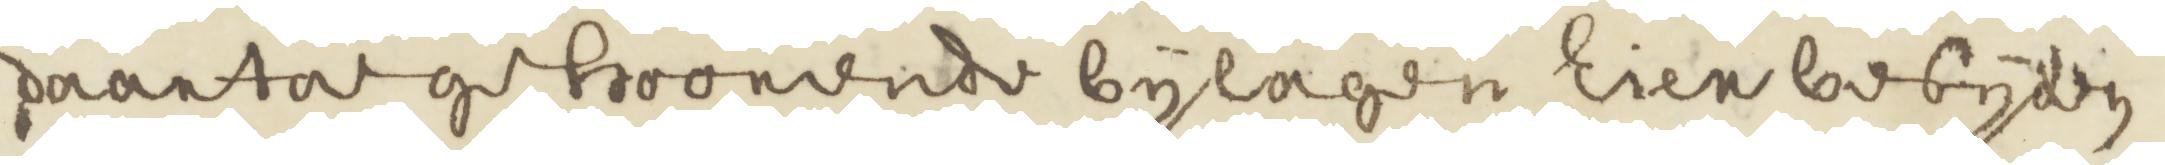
daartoe gehoorende bijlagen hier besijden
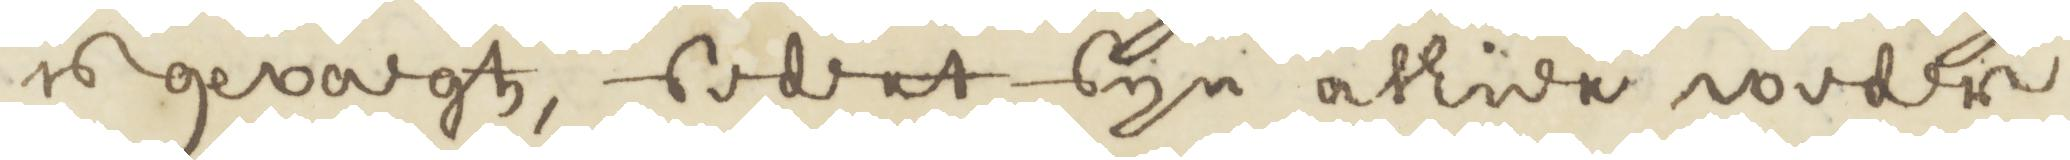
is gevoegt, sedert sijn alhier weder
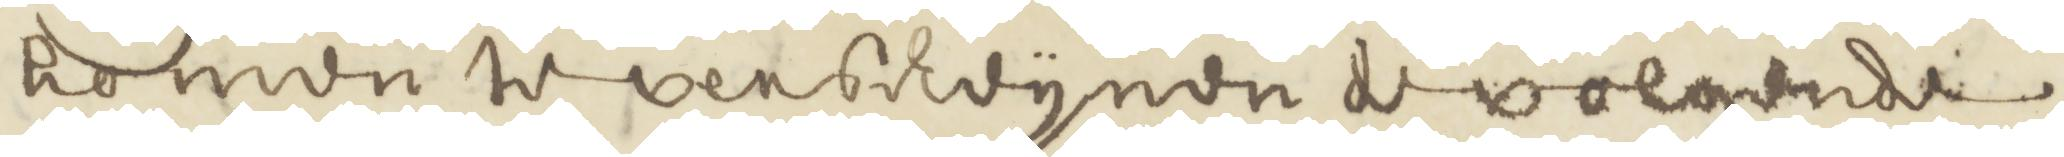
komen te verscheijnen de volgende
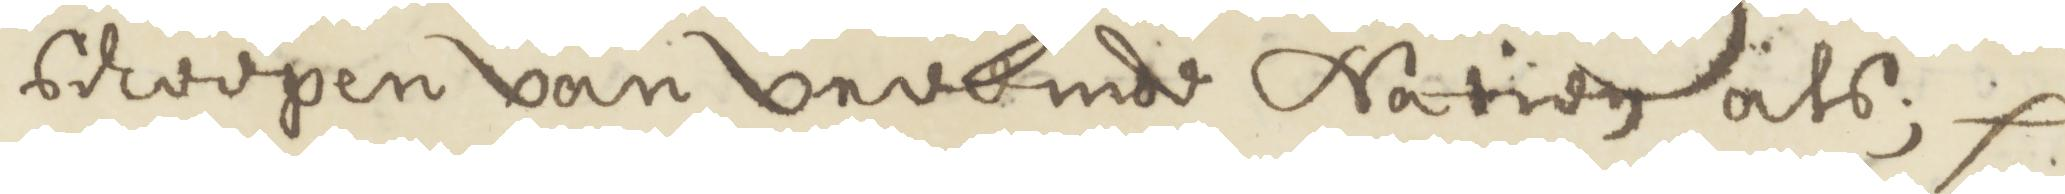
scheepen van vreemde Natien als;
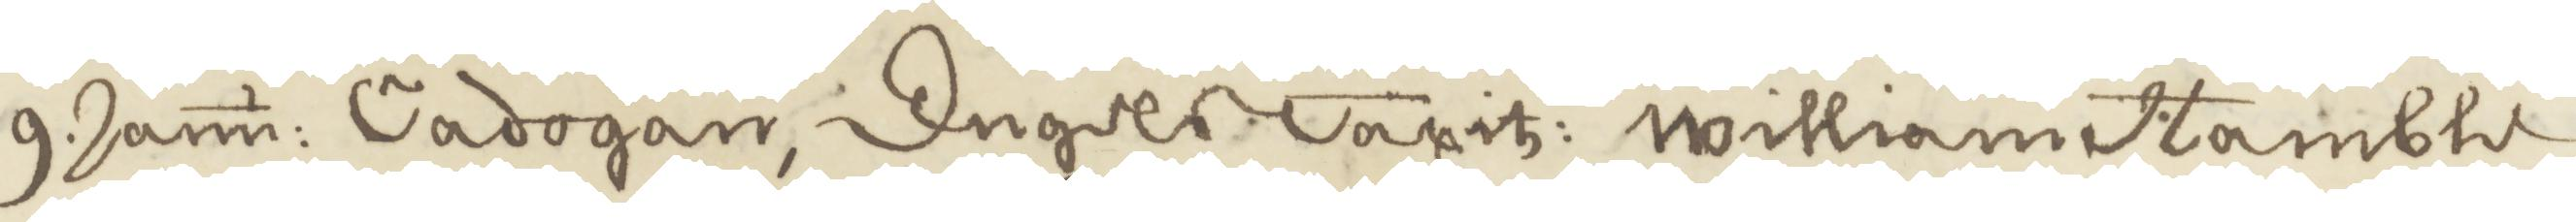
9. Janu: Cadogan, Engels capit: william Hamble
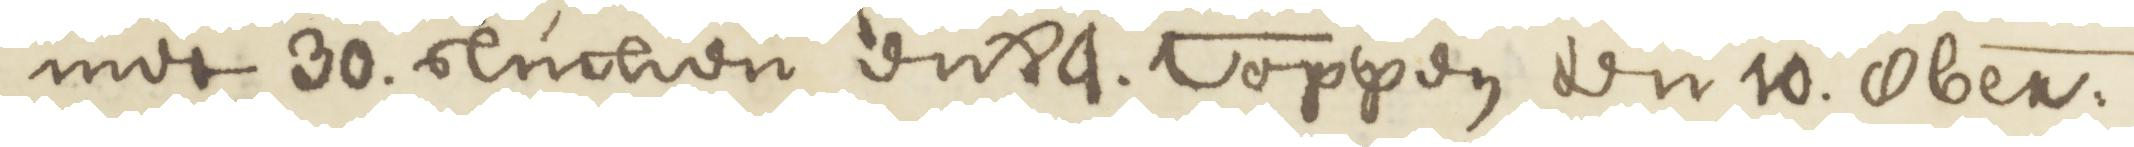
met 30. stucken en 84. Coppen den 10. 8ber:
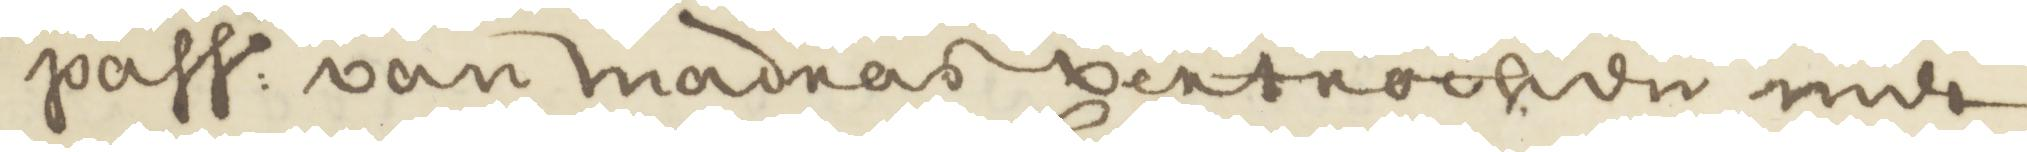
pass:o van madras vertrocken met
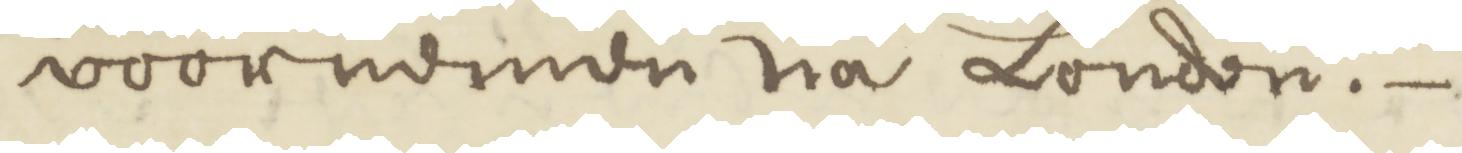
voornemen na Londen. —
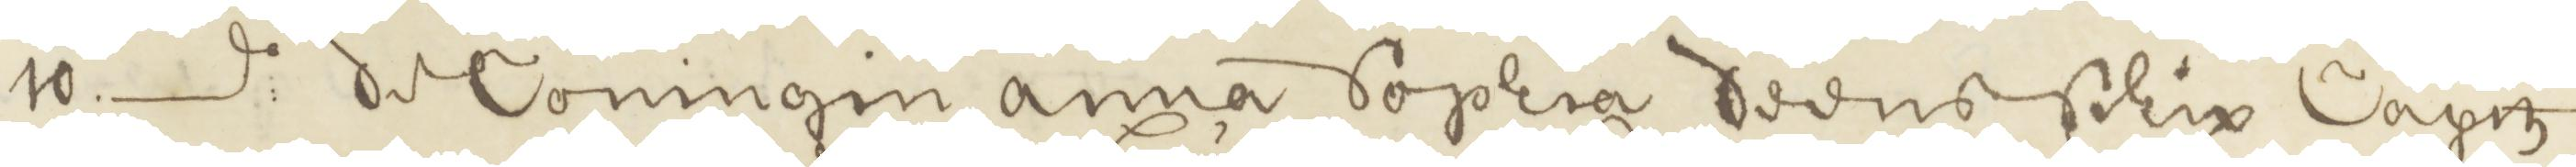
10. _:o de Coningin anna sophia deens schip Capitn
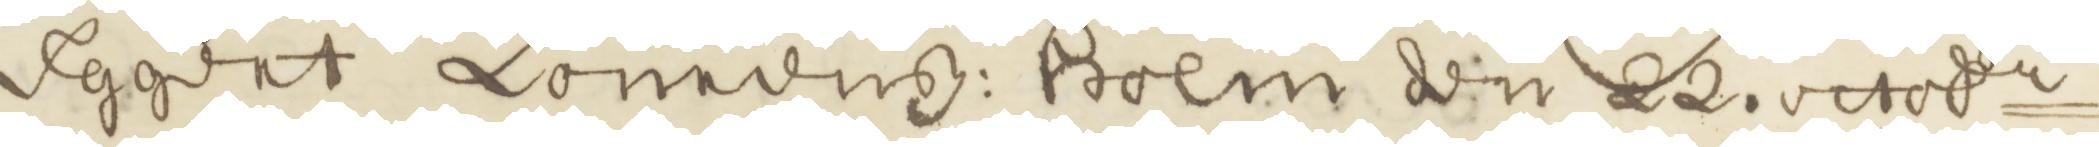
Eggert Lourensz: holm den 22. octob=r
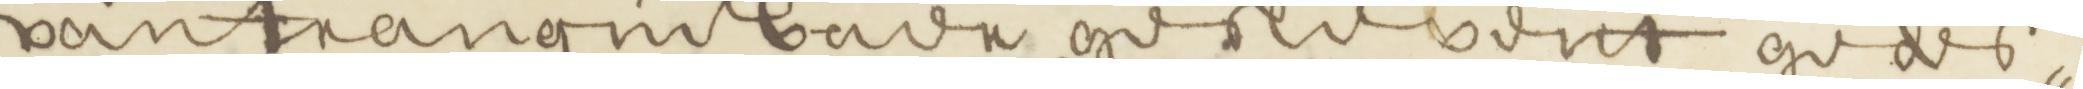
van tranquebaer gestevent gedes„
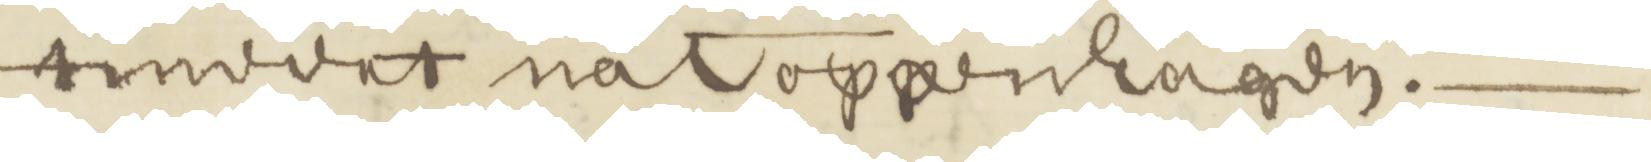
tineert na Coppenhagen. —
